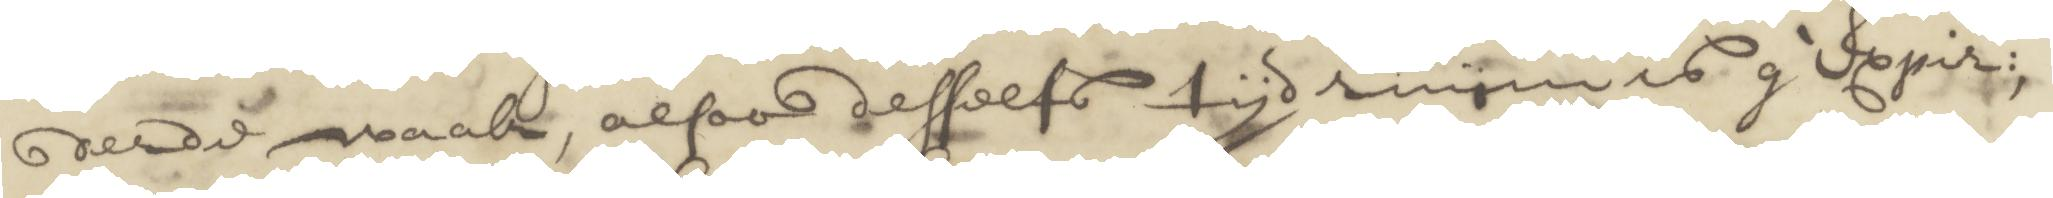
derde waak, alsoo desselfs tijd ruijm is g’Expir:t,
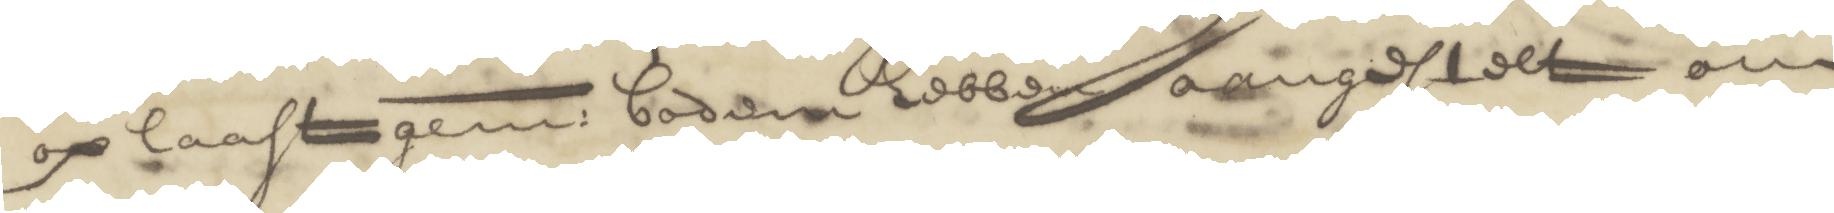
op laast gem: bodem hebben aangestelt om
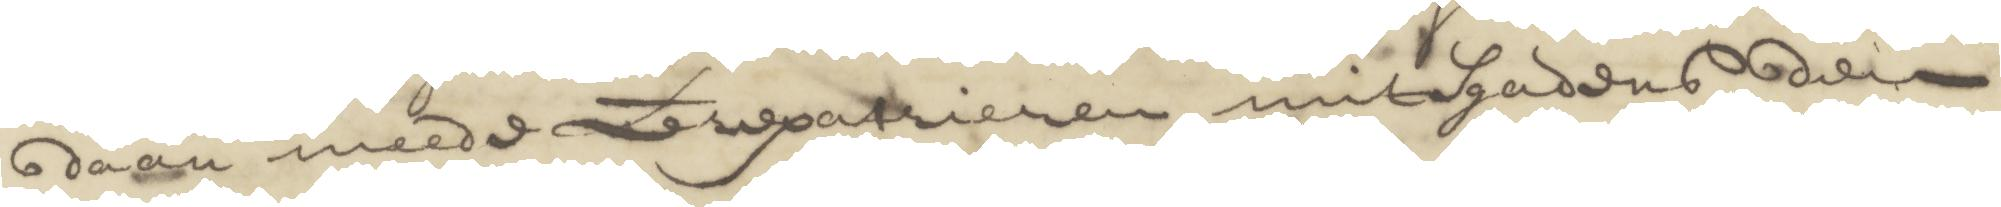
daar meede te repatrieren, mitsgaders den
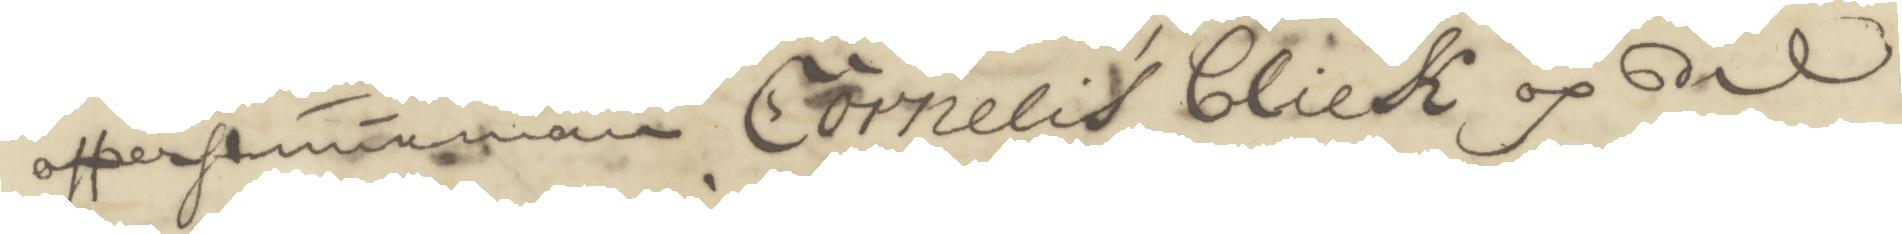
opperstuurman Cornelis bliek op de
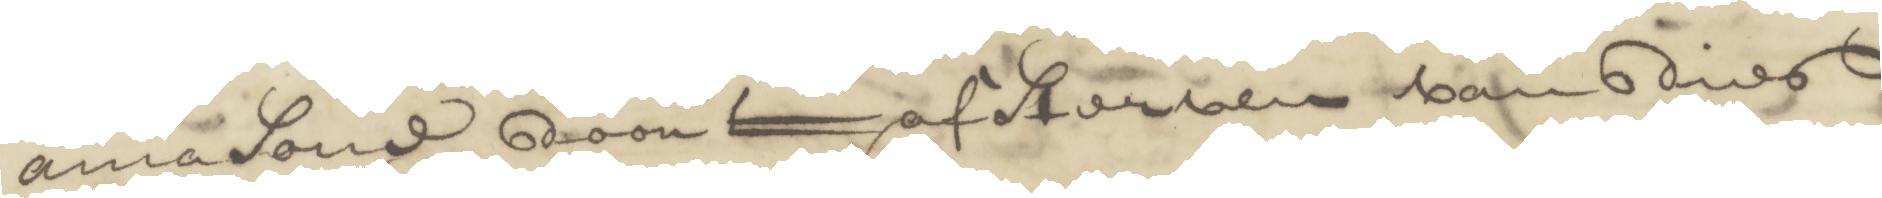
amasone door 't af'sterven van dies
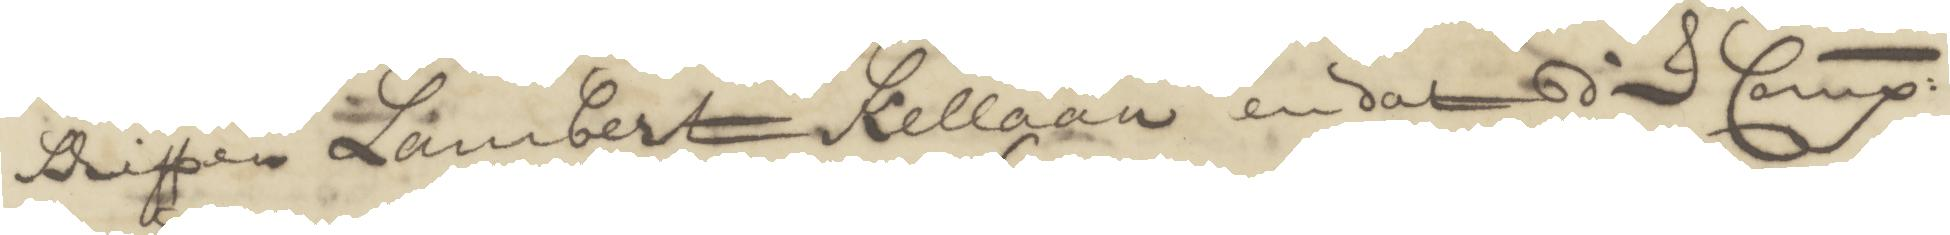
schipper Lambert Kellaan en dat d’E Comp:
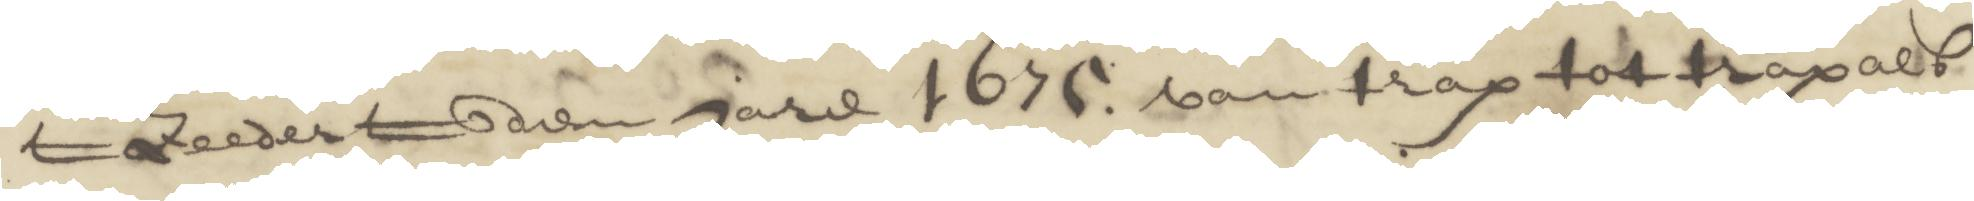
t zeedert den jare 1675. van trap tot trap als
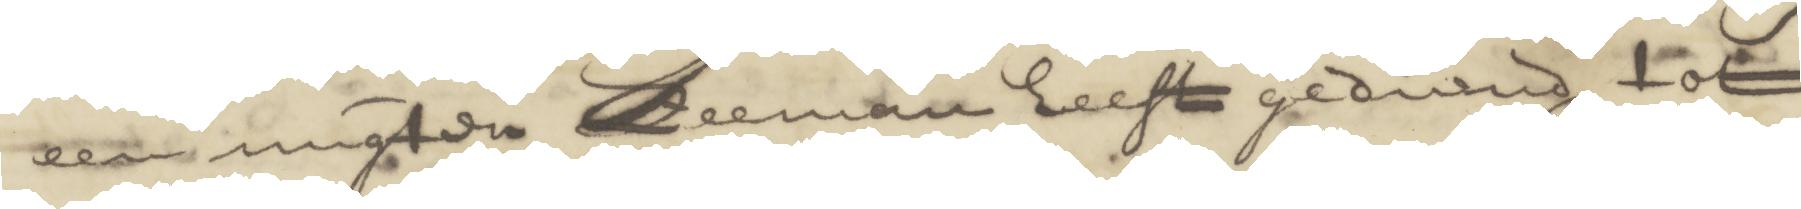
een nugter zeeman heeft gediend tot
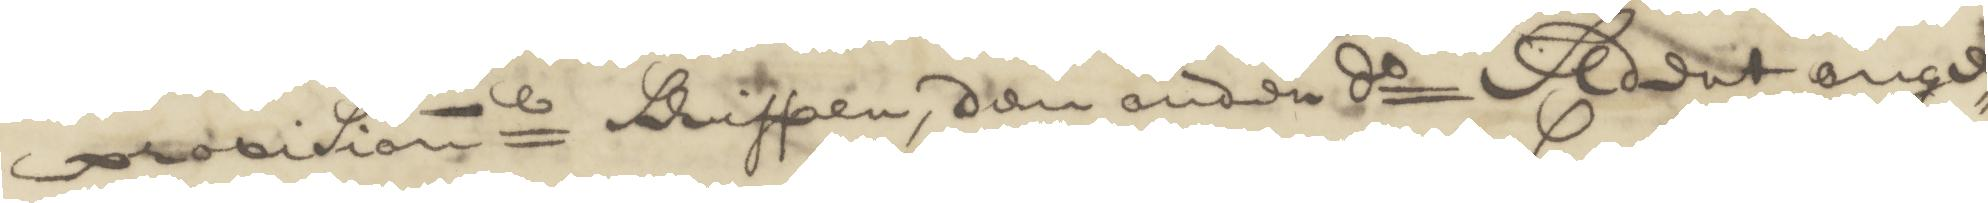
provision=l schipper, den onder d=o sedert onge„
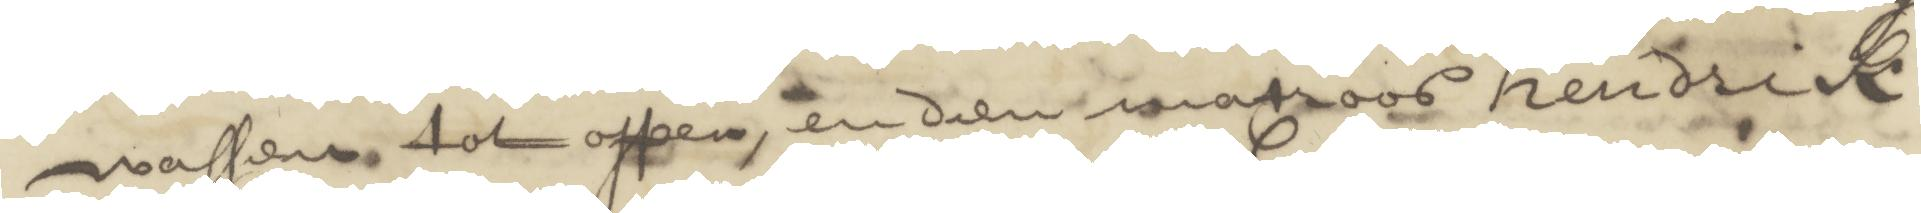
wassen tot opper, en den matroos hendrik
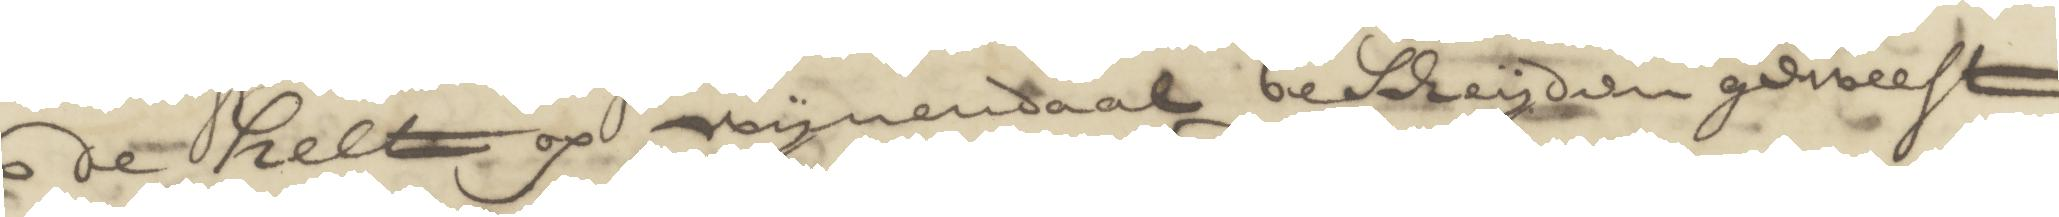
de helt op wijnendaal bescheijden geweest
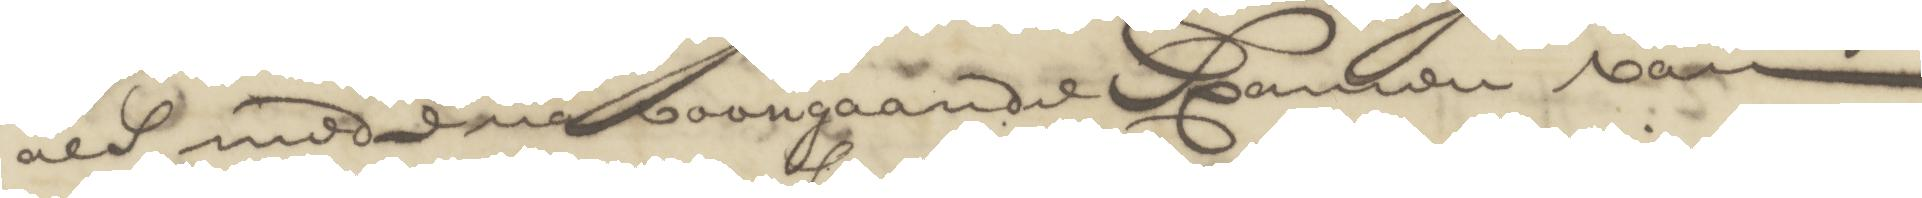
als mede na voorgaande Examen van
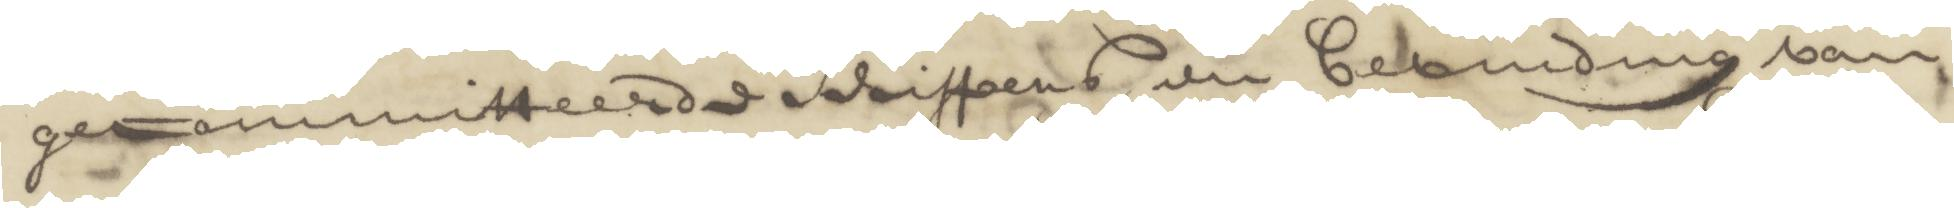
gecommitteerde schippers, en bevinding van
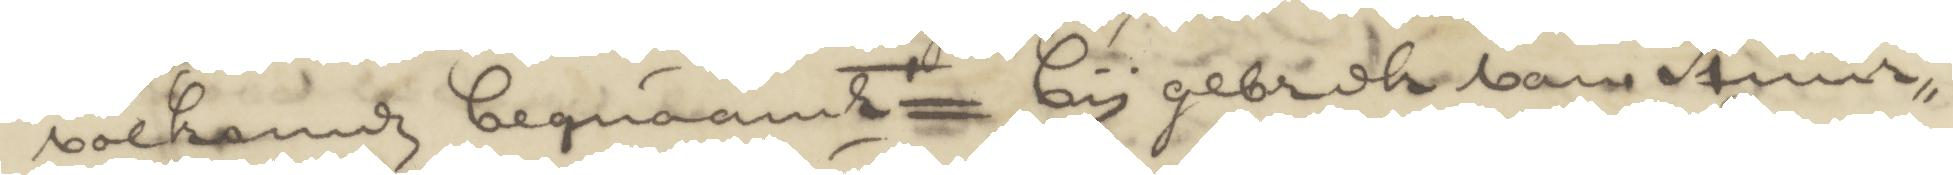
volkomen bequaamh=t bij gebrek van stuur„
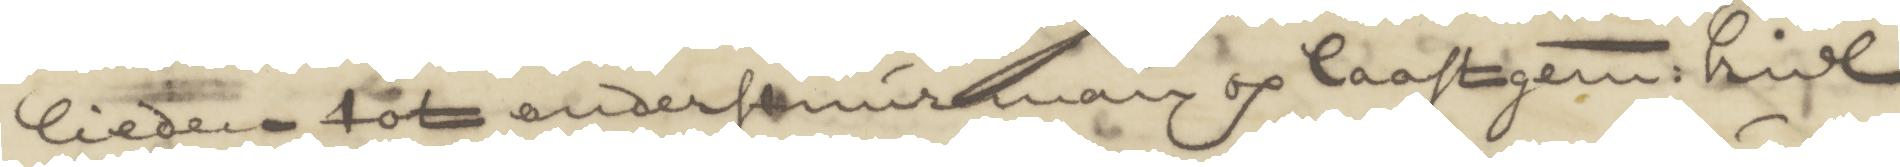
lieden tot onderstuurman op laast gem: kiel
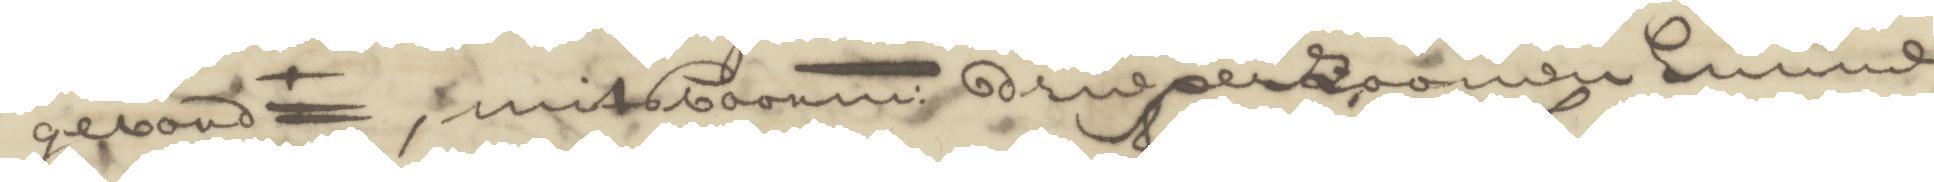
gevord=t, mits voorm: drie perzoonen hunne
